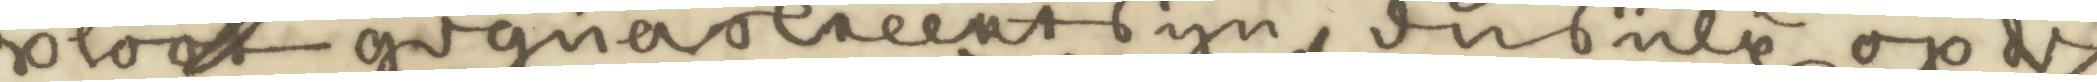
vloot geguastreert sijn, en sulx op de
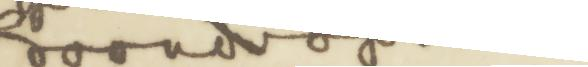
voor de opsiend:s
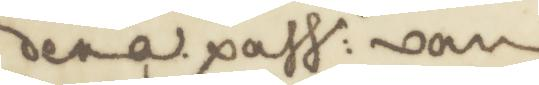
der a.o pass:o van
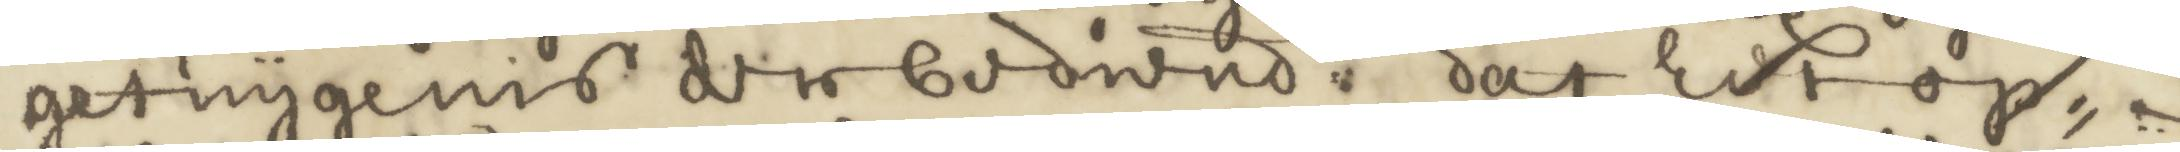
getuijgenis der bediend:s dat het op„
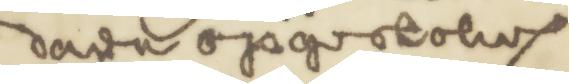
daer op gestoke
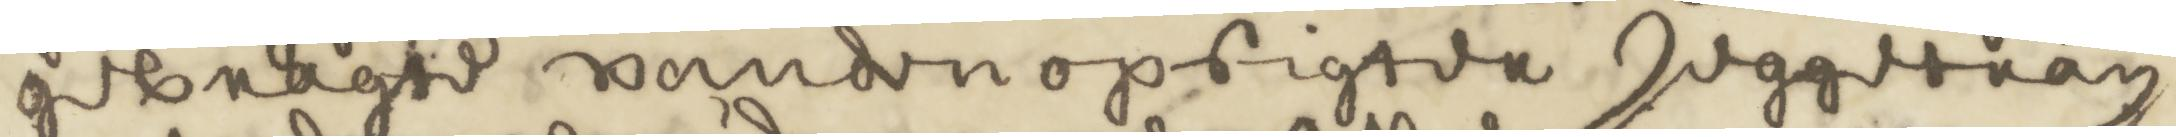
gebragte vanden opsigter Jeggetraij
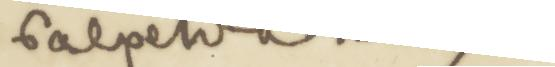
salpeter vloot.
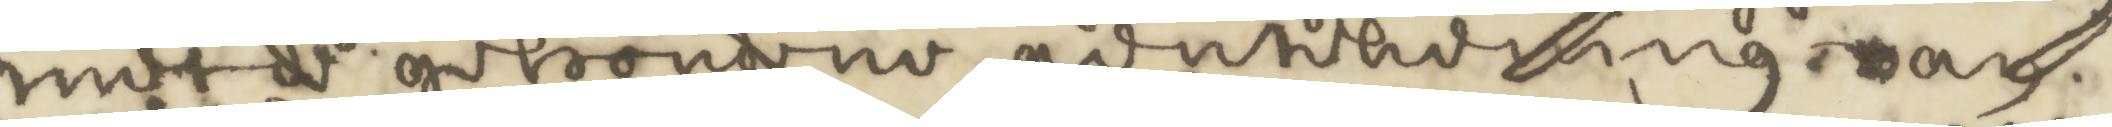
met de gehoudene aentekening van.
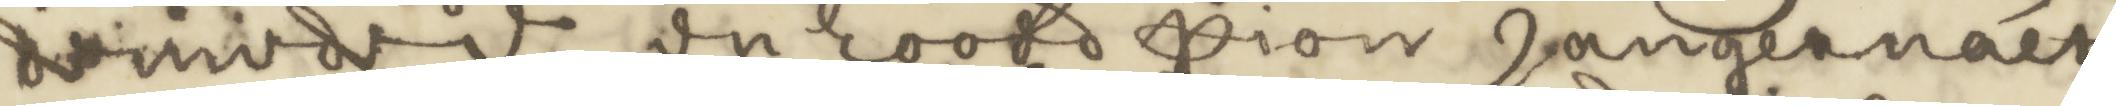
de mede d:o en hoofd pion Jangernaet
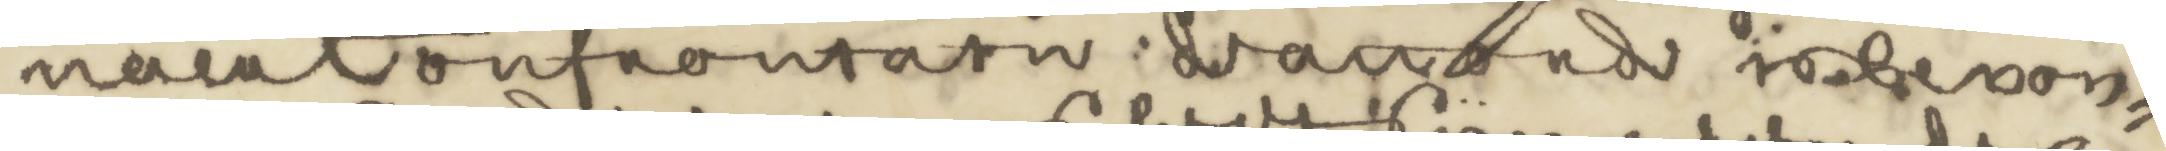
naer confrontatie de accorde is bevon„
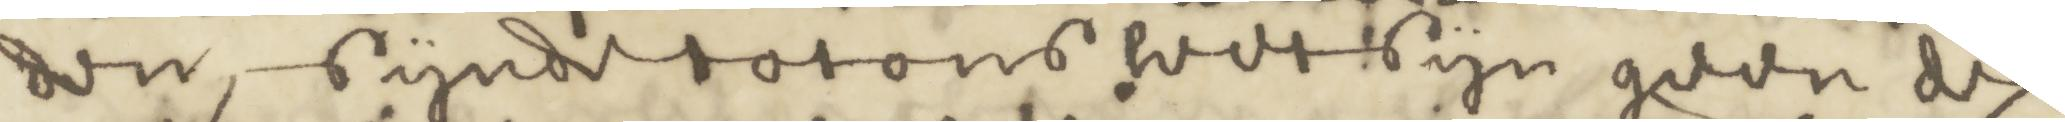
den, sijnde tot ons het sijn geen de
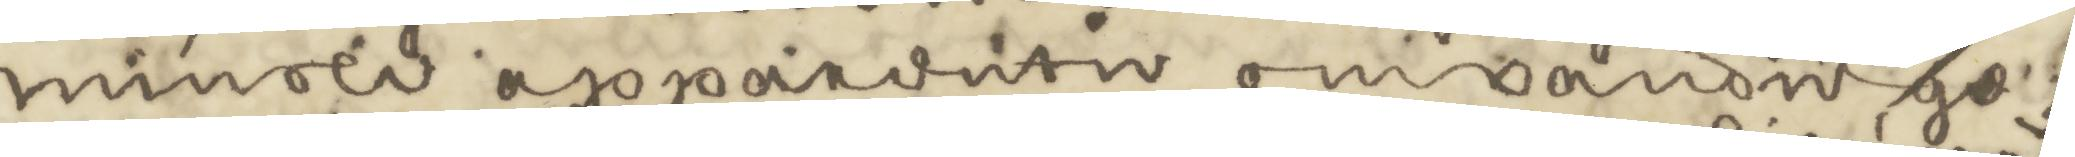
minste apparentie om van die ge„
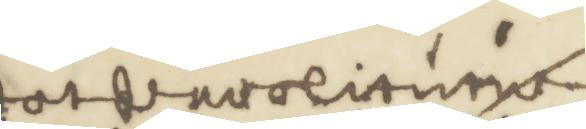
tot de resolutie
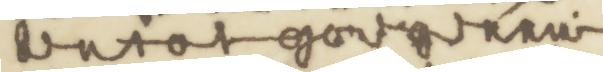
der tot goegerrie
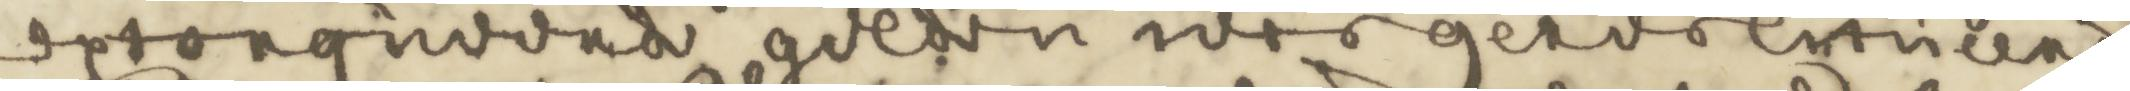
extorqueerde gelden iets gerestitueerd
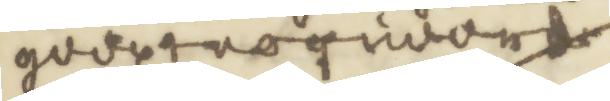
geextroqueerde
